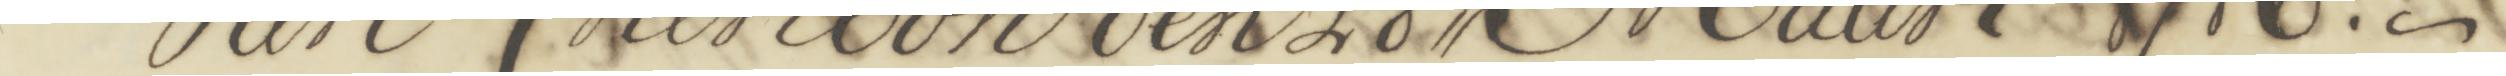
Van Cheribon den 28„e Maart 1716.~
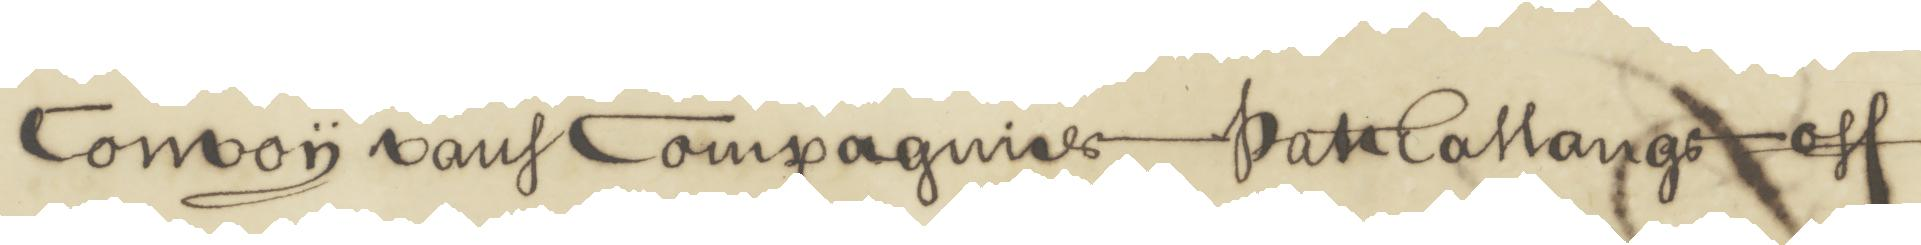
Convoij van's Compagnies patchallangs off
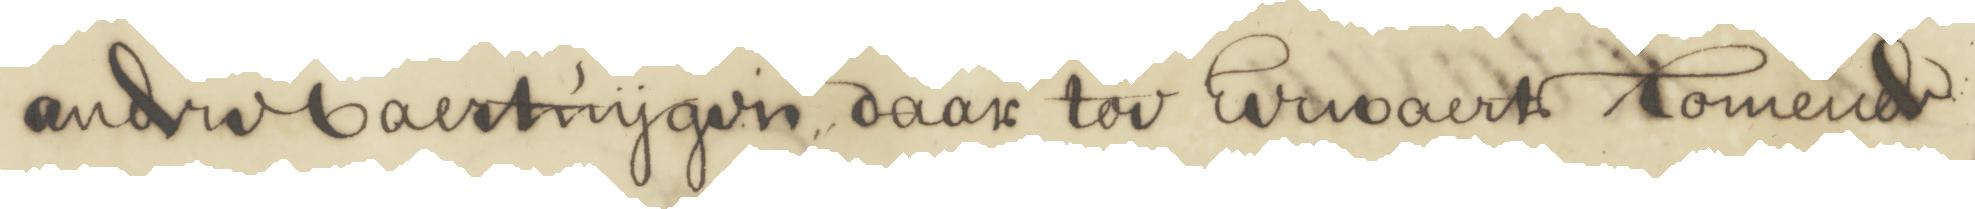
andre vaertuijgen, daar toe henwaerts komende
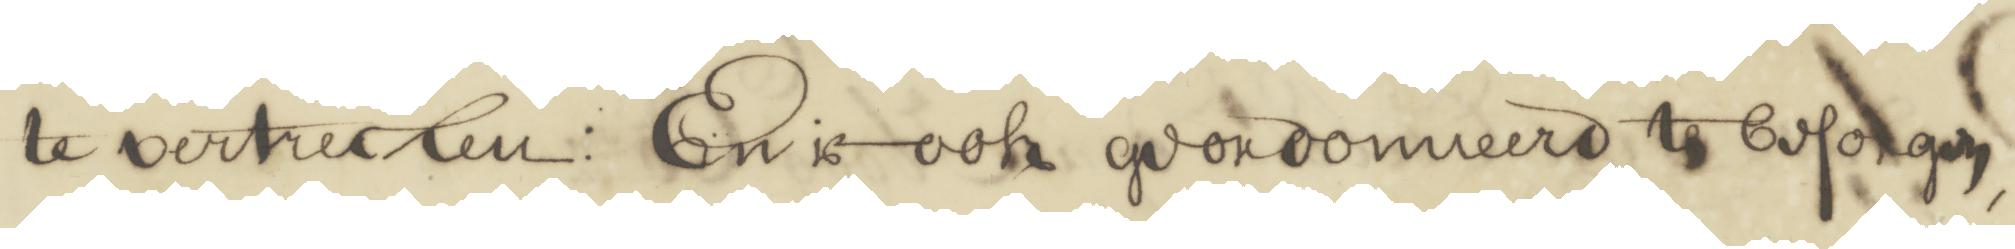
te vertrecken: En is ook geordonneerd te besorgen,
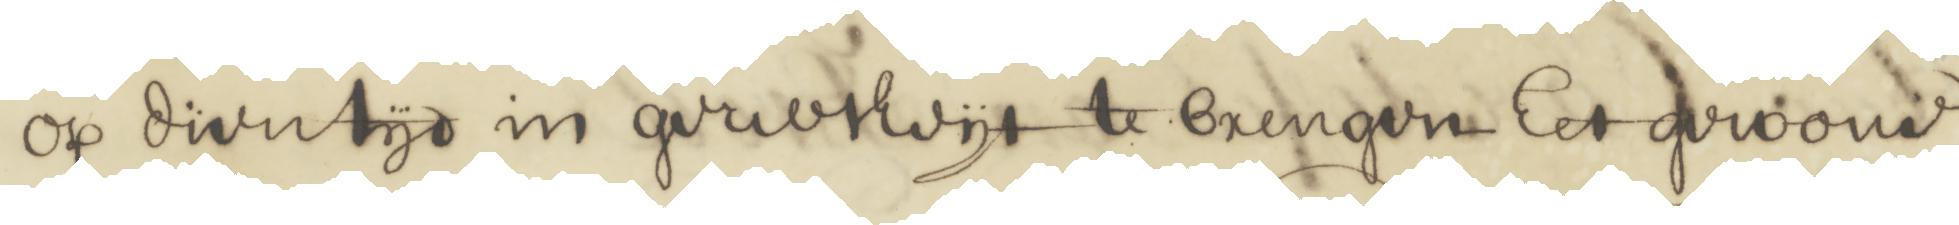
op dien tijd in gereetheijt te brengen het gewone
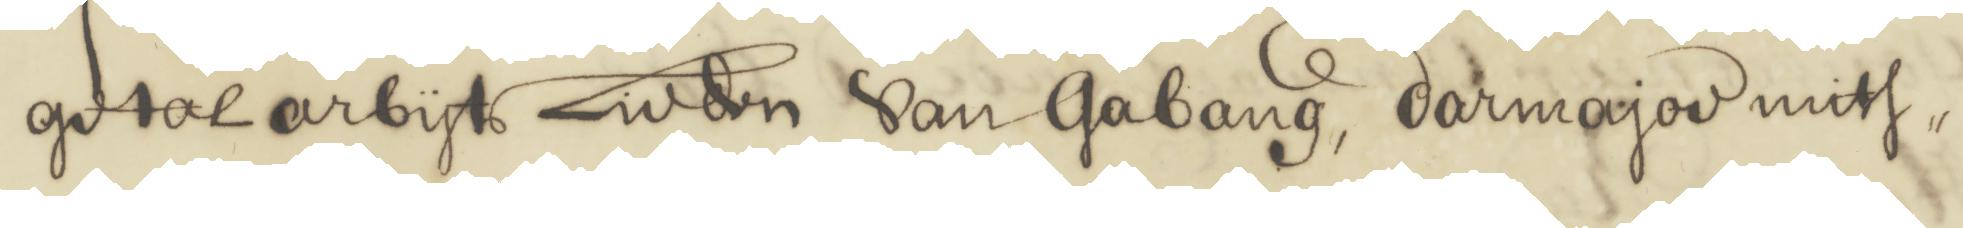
getal arbijts Lieden van gabang, darmajoe mits„
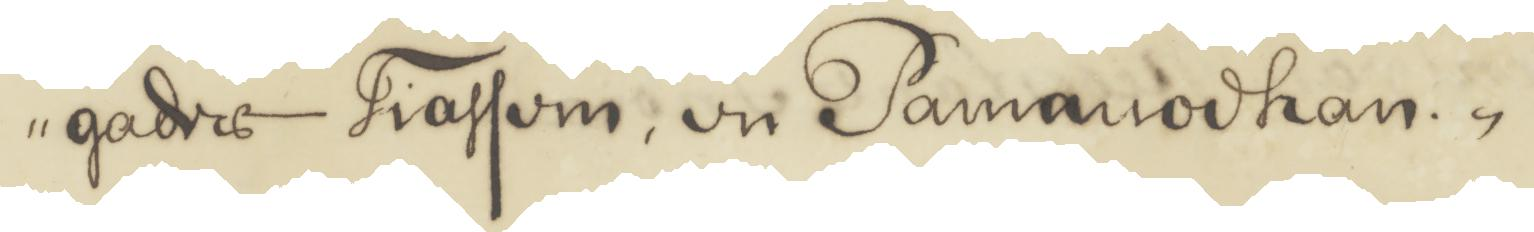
„gaders Tiassem, en Pamanoekan.~
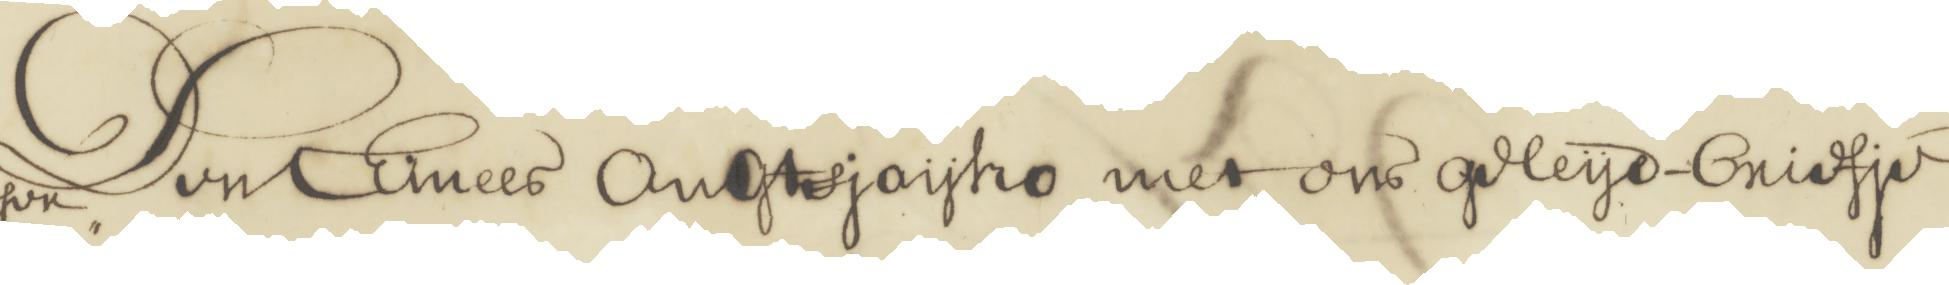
Den Chinees Ongtsjaijko met ons geleijd briefje
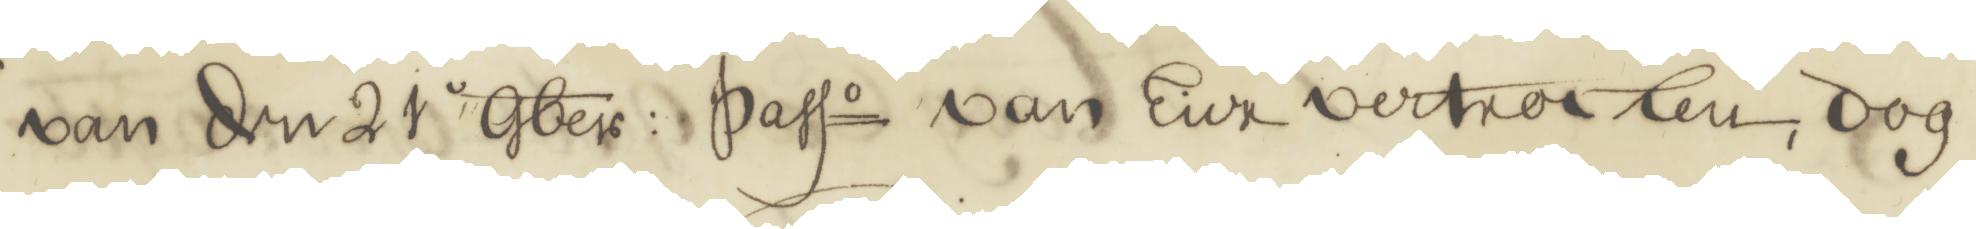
van den 21:e gber: Pass=o van hier vertrocken, dog
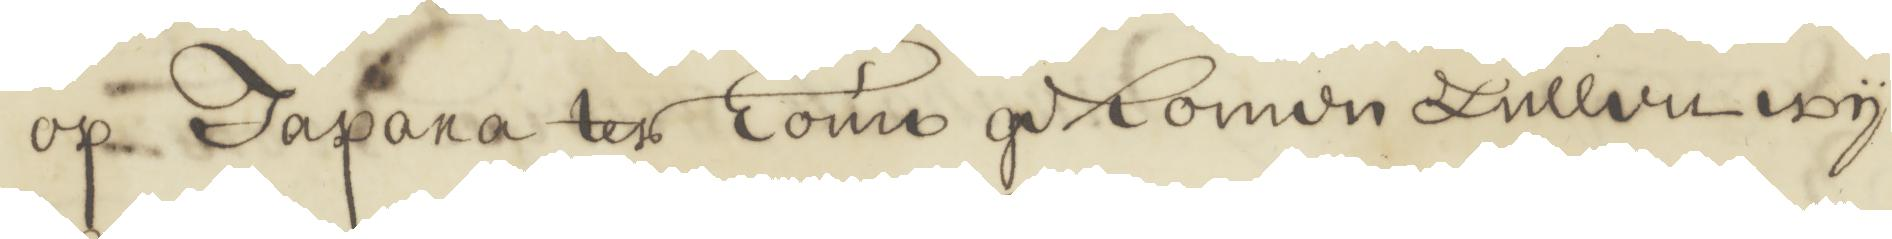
op Iapara ter houw gekomen Zullen wij
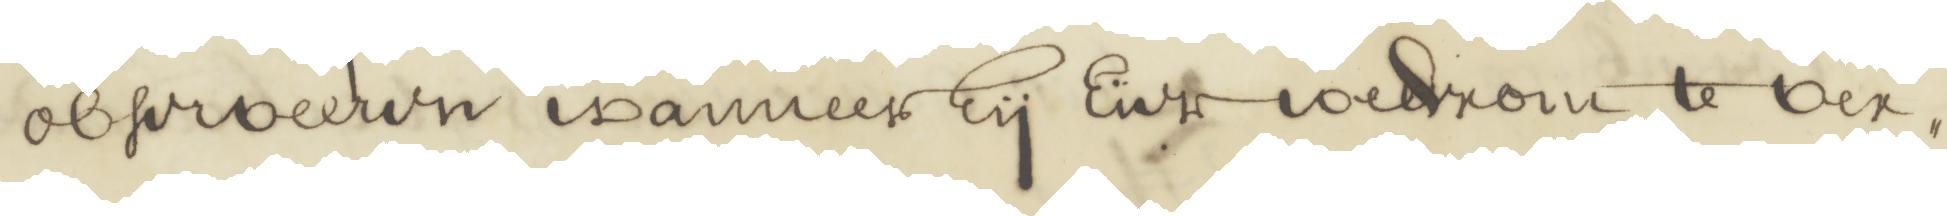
obseveeren wanneer hij hier wedrom te ver„
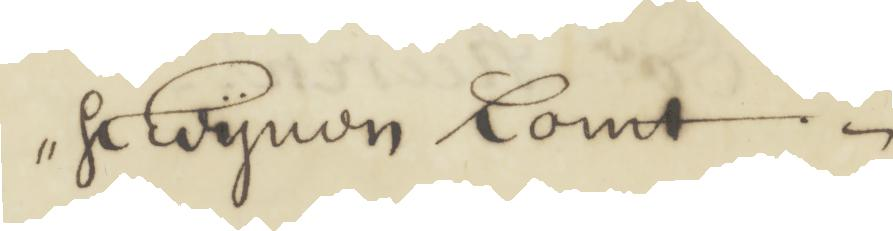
„scheijnen komt.
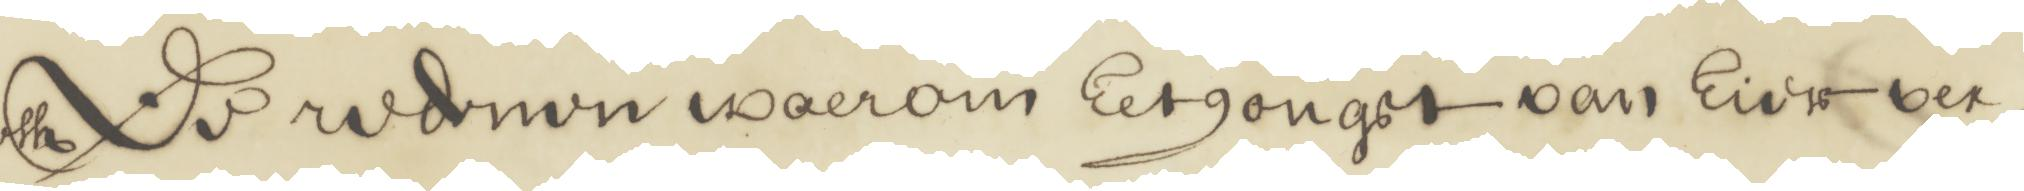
De redenen waerom het jongst van hier ver
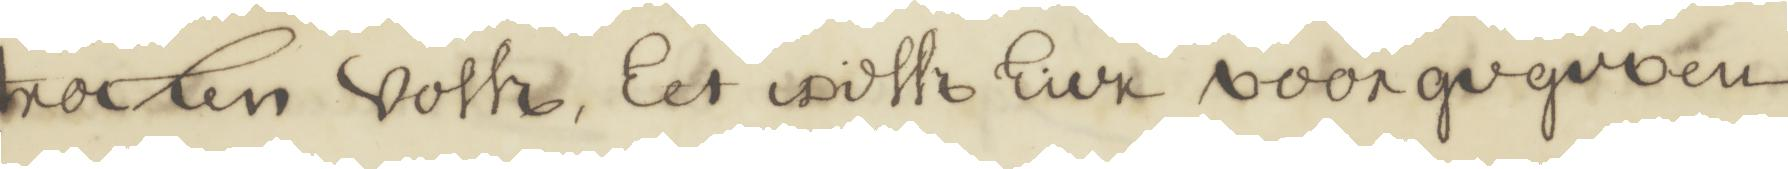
trocken volk, het welk hier voorgegeven
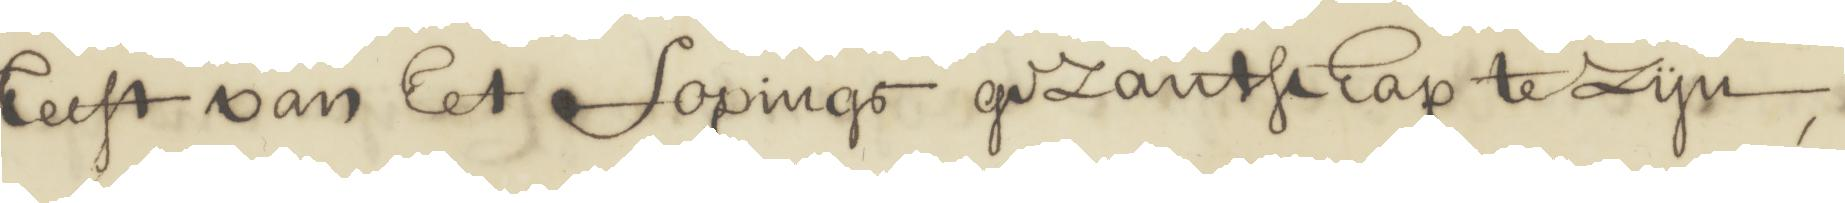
heeft van het Sopings gezantschap te Zijn,
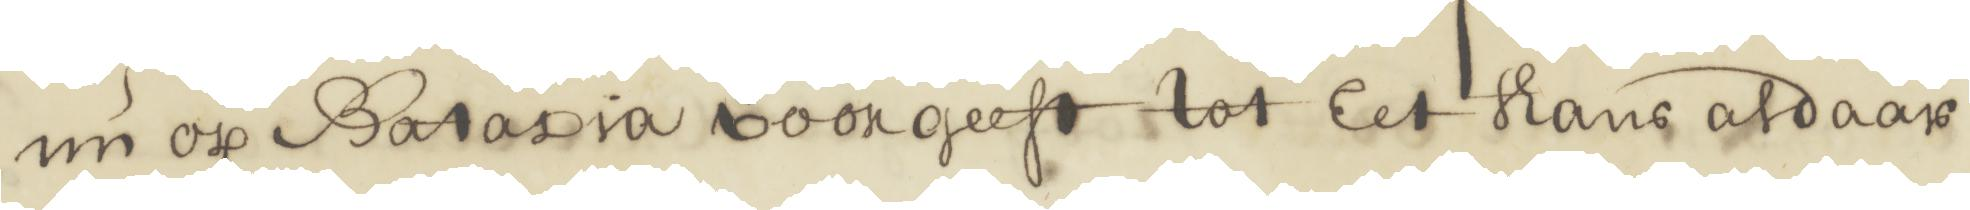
nu op Batavia voorgeeft tot het thans aldaar
